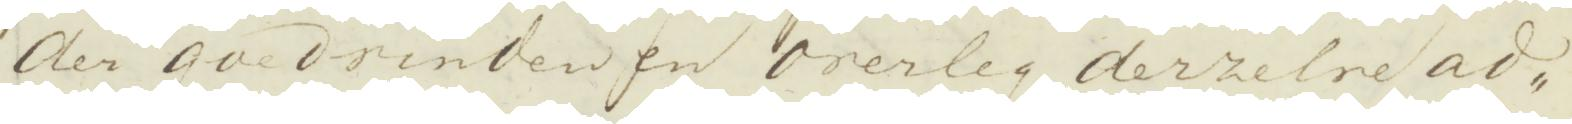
der goedvinden en overleg derzelve ad„
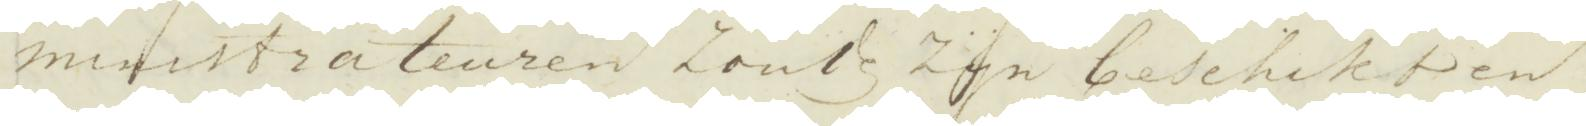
ministrateuren zoude zijn beschikt en
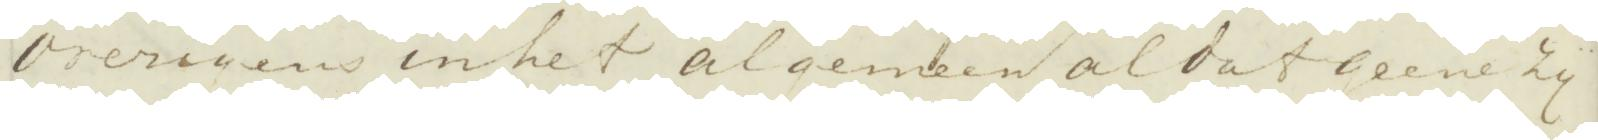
overigens in het algemeen al dat geene zij
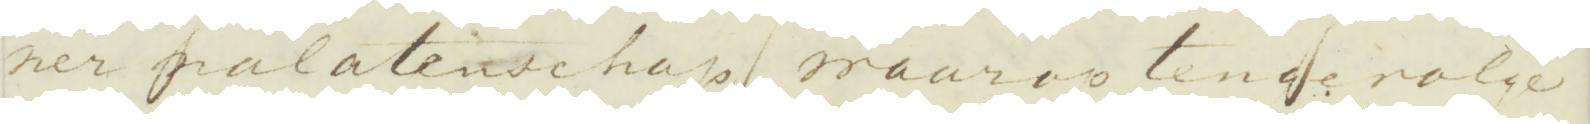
ner nalatenschap waarop ten gevolge
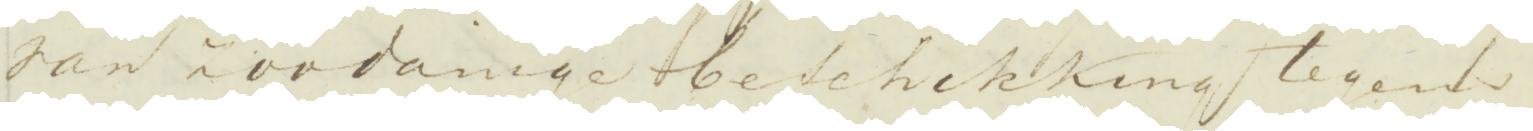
van zoodanige beschikking, tegen
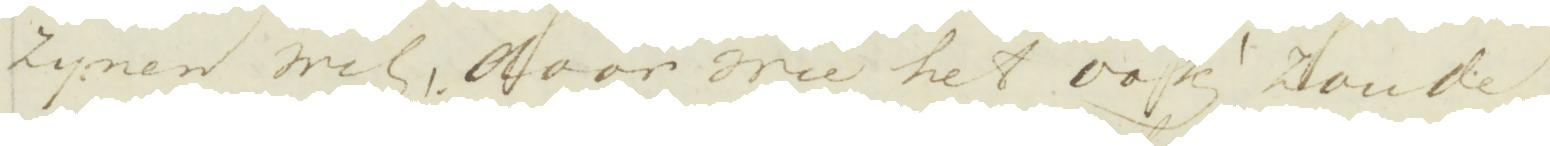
zynen wil, door wie het ook zoude
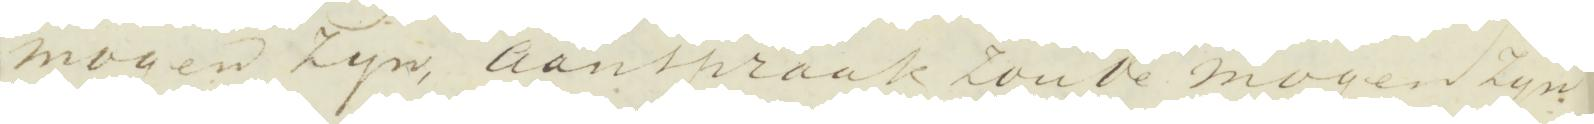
mogen zyn, aanspraak zoude mogen zyn
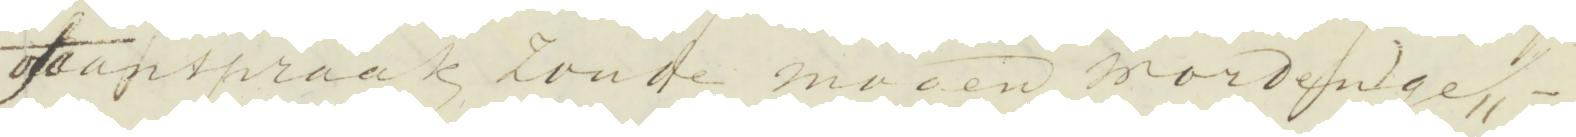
of aanspraak zoude mogen worden ge„-
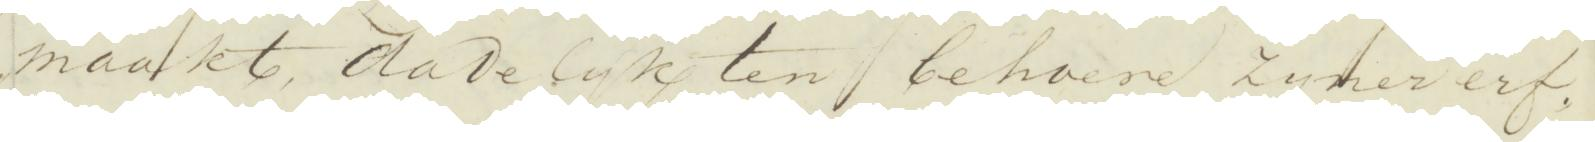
maakt, dadelijk ten behoeve zyner erf„
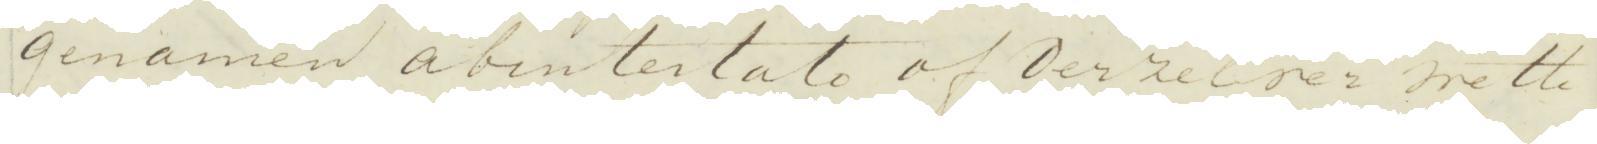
genamen abintestato of derzelver wetti
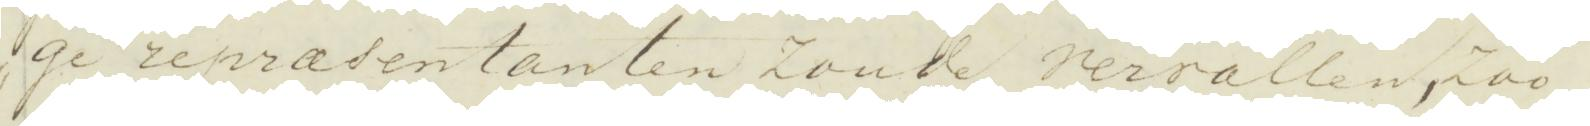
ge repraesentanten zoude vervallen, zoo
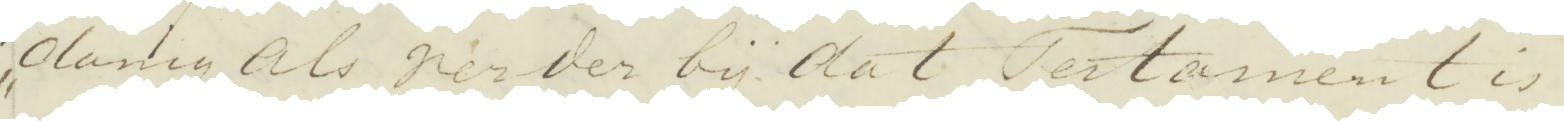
„danig als verder bij dat Testament is
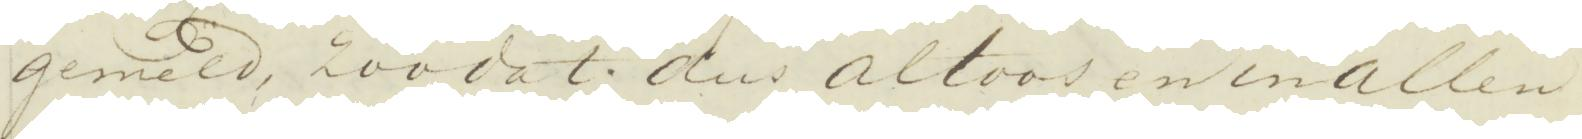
gemeld, zoodat dus altoos en in allen
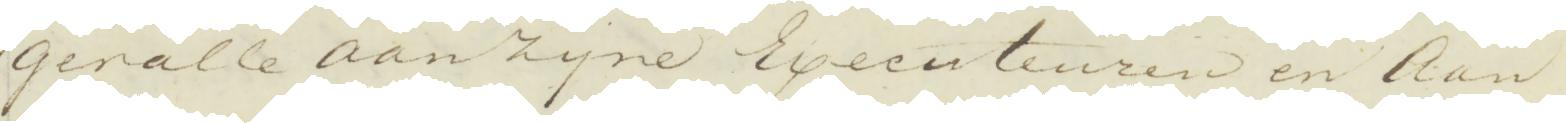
gevalle aan zijne Executeuren en Aan
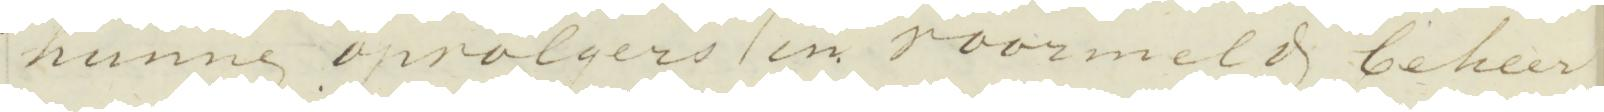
hunne opvolgers in voormeld beheer
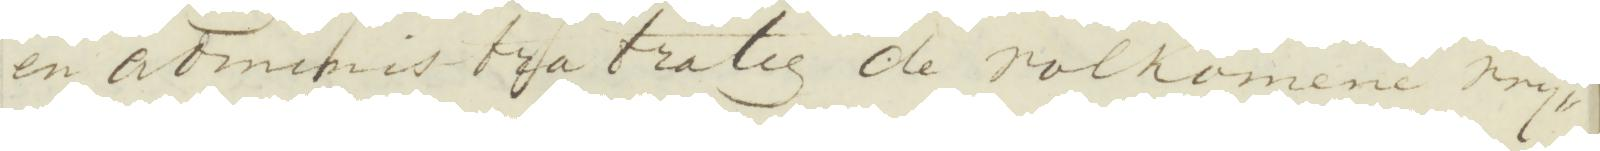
en administratratien de volkomene vry
